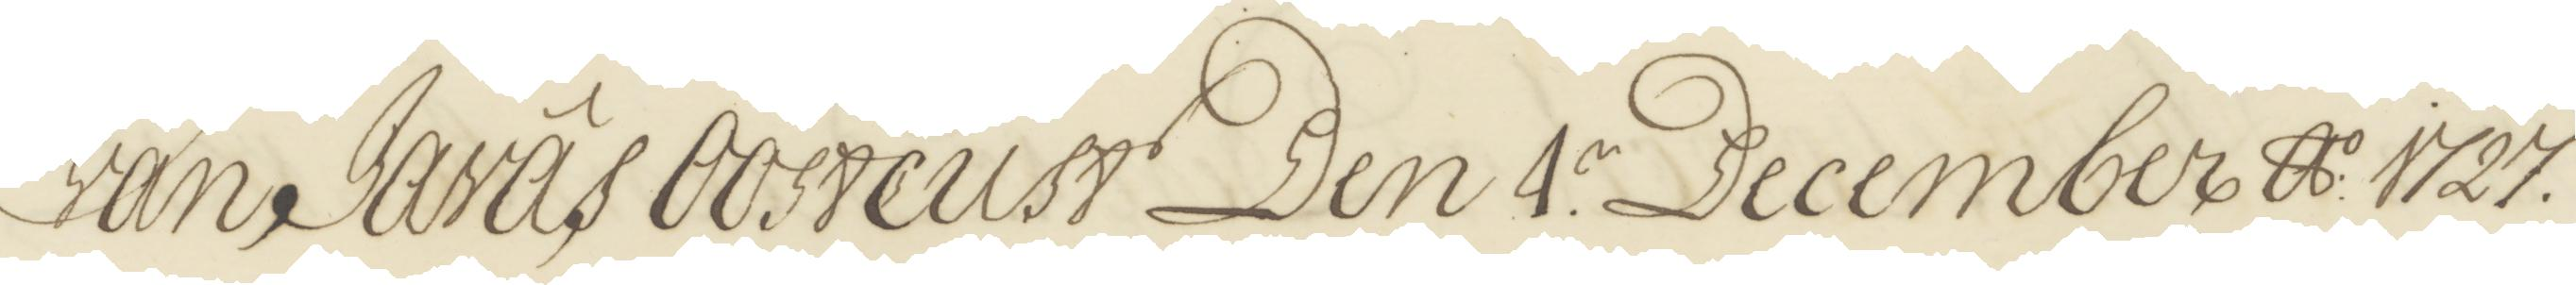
Van Javâs Oost cust Den 4.e December A:o 1727.
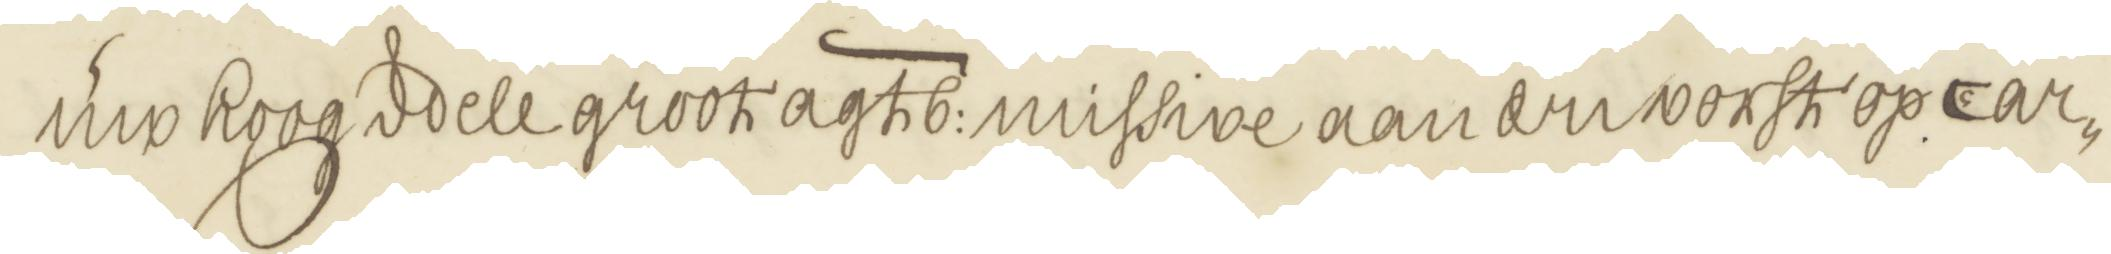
uw hoog Edele groot agtb: missive aan den vorst op car„
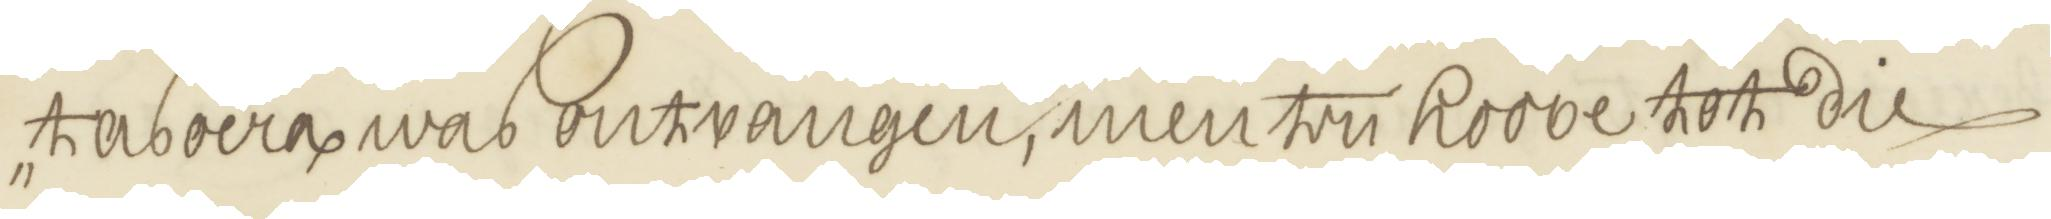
„tasoera was ontvangen, men ten hoove tot die
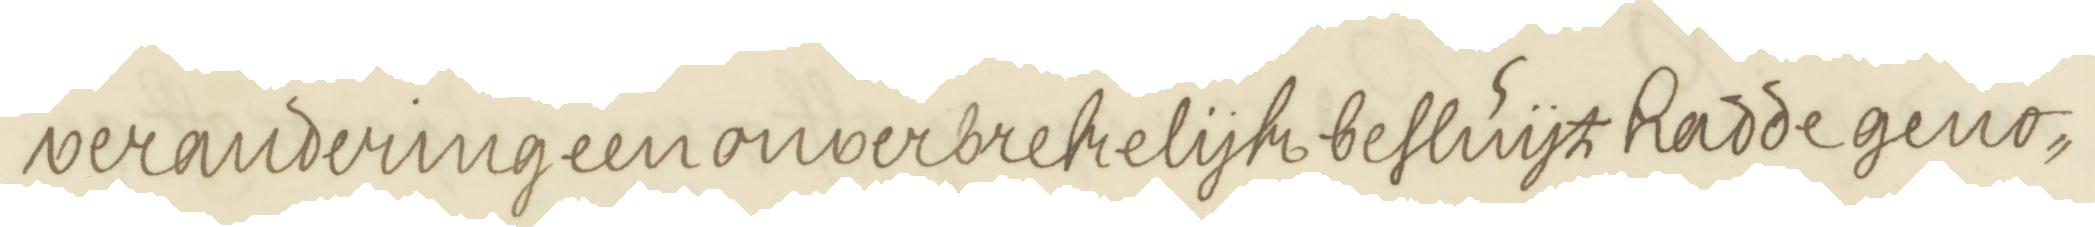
verandering een onverbrekelijk besluijt hadde geno„
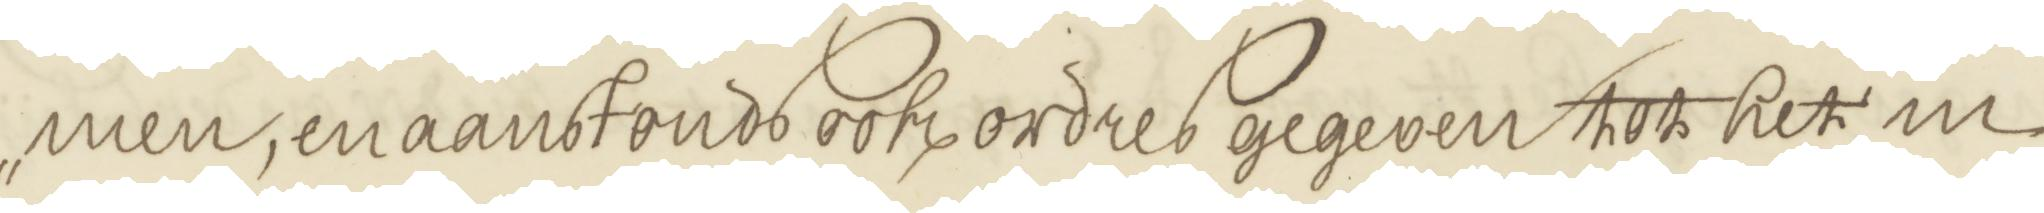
„men, en aanstonds ook ordres gegeven tot het in
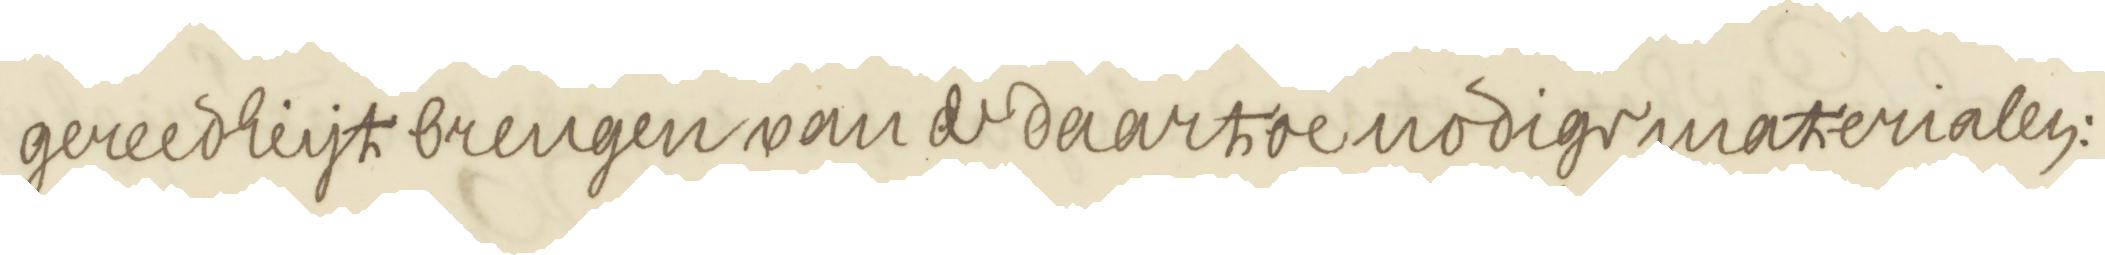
gereedheijt brengen van de daartoe nodige materialen:
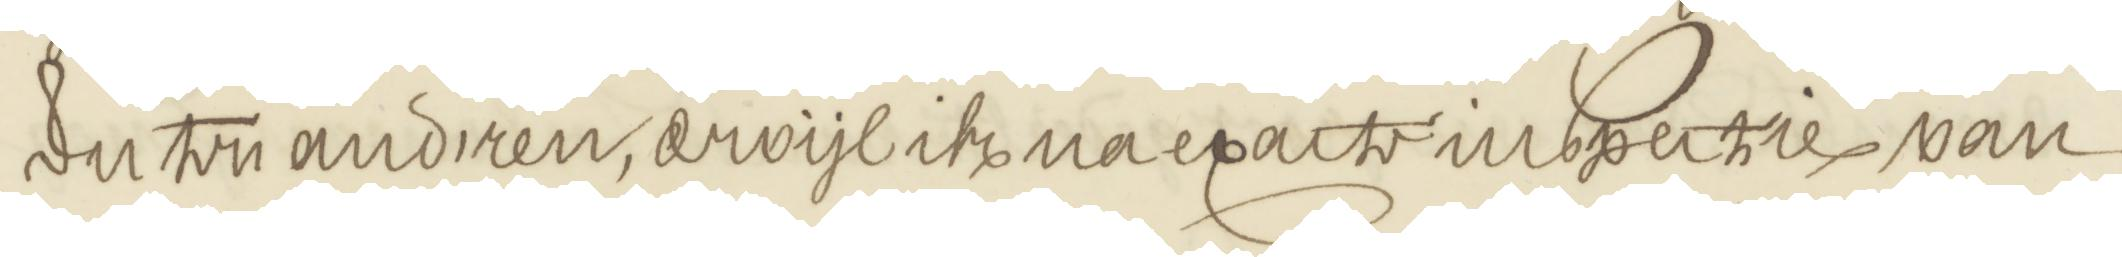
En ten and'ren, dewijl ik na exacte inspectie van
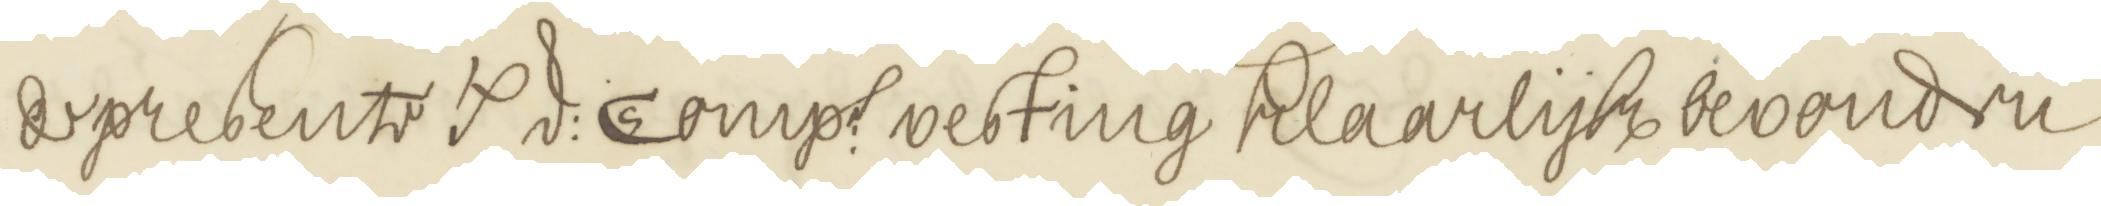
de present 's E: comp:s vesting klaarlijk bevonden
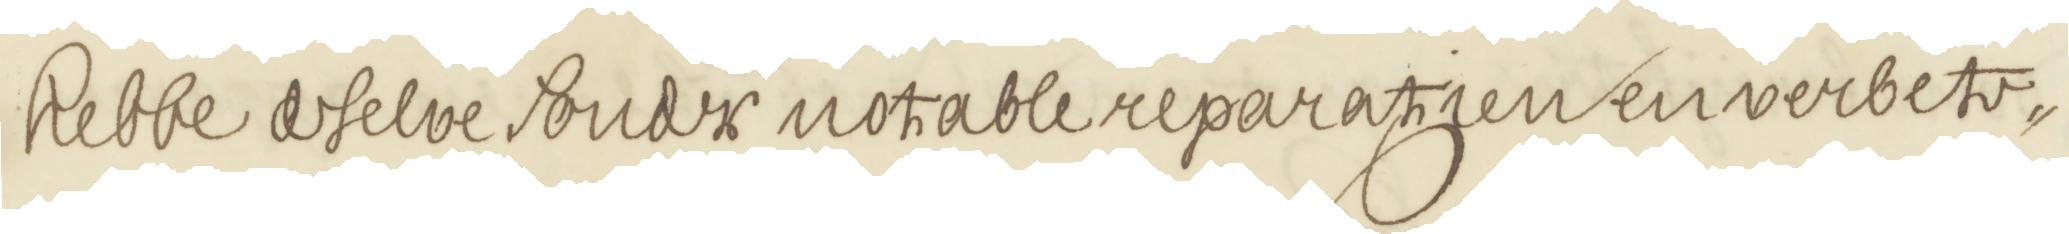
hebbe deselve sonder notable reparatien en verbete„
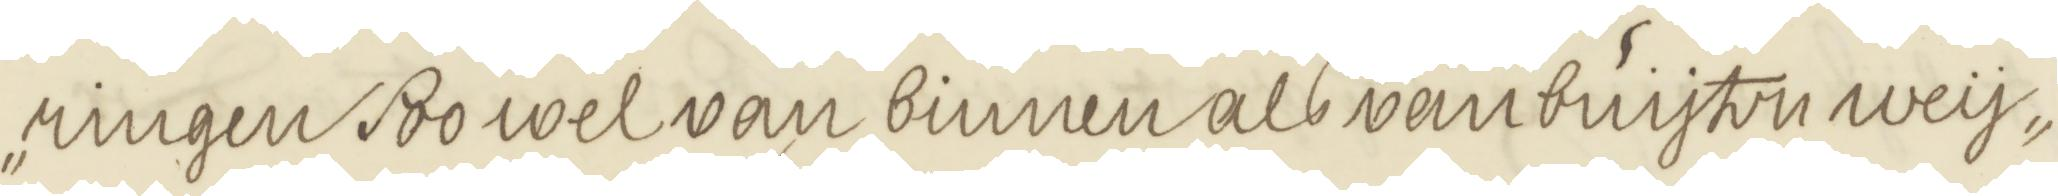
„ringen soo wel van binnen als van buijten weij„
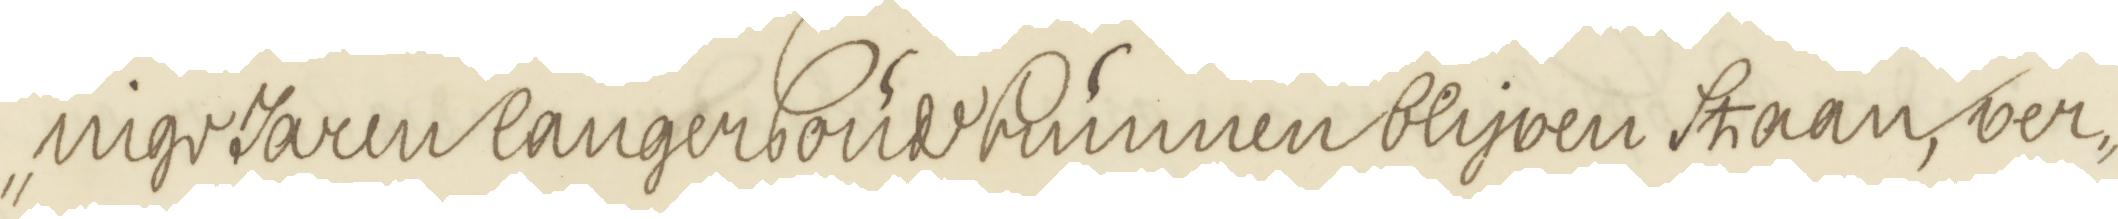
„nige Jaren langersoude kunnen blijven staan, ver„
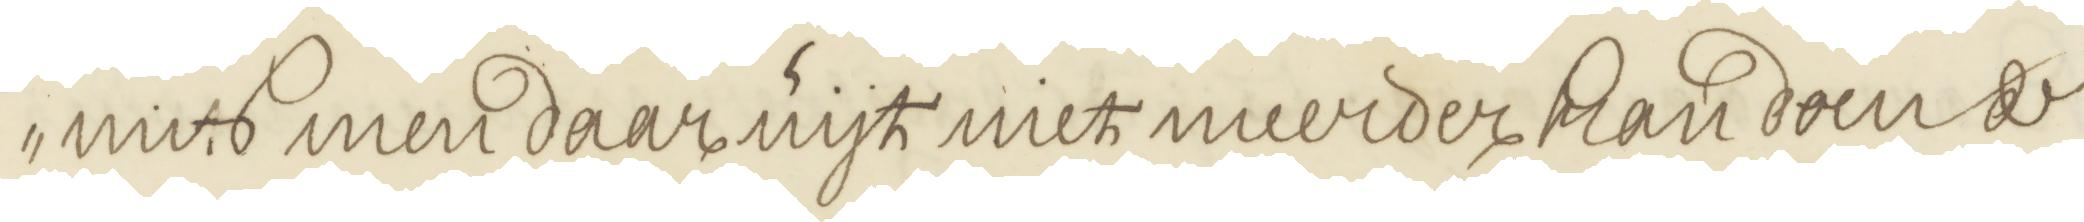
„mits men daar uijt niet meerder kan doen de
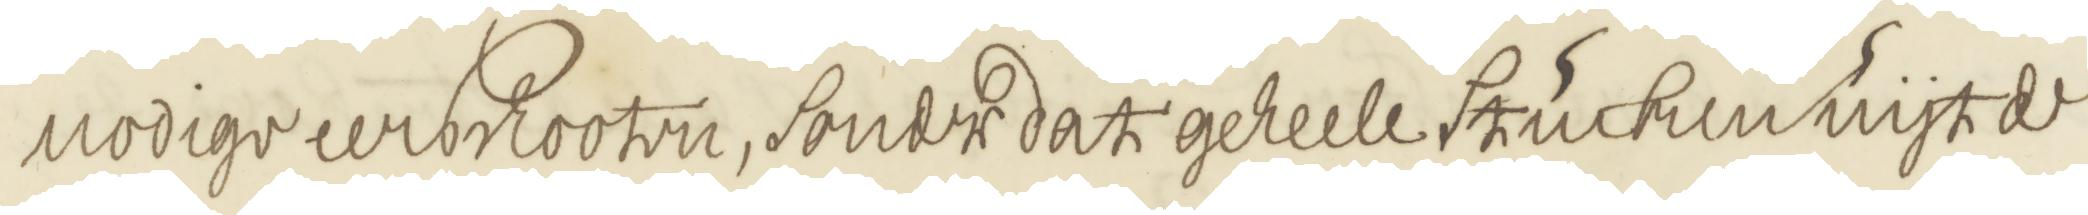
nodige eerschooten, sonder dat geheele stucken uijt de
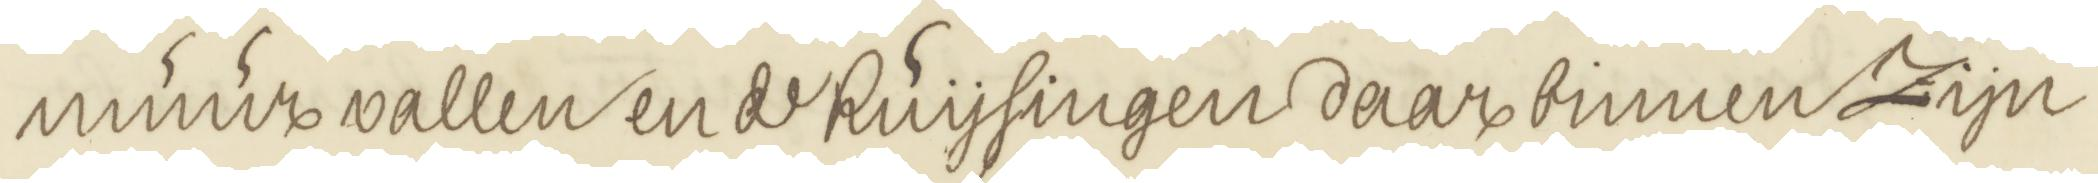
muur vallen en de huijsingen daar binnen zijn
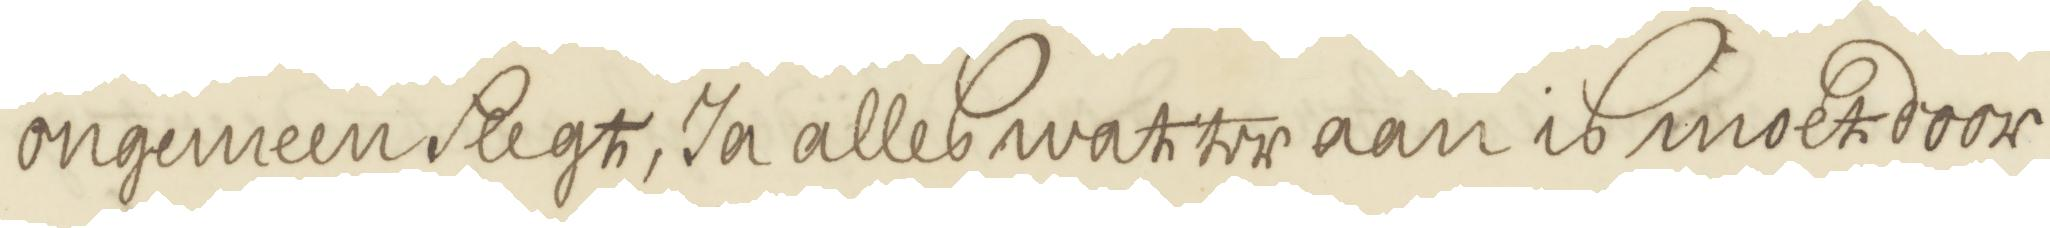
ongemeen slegt, Ja alles wat ter aan is moet door
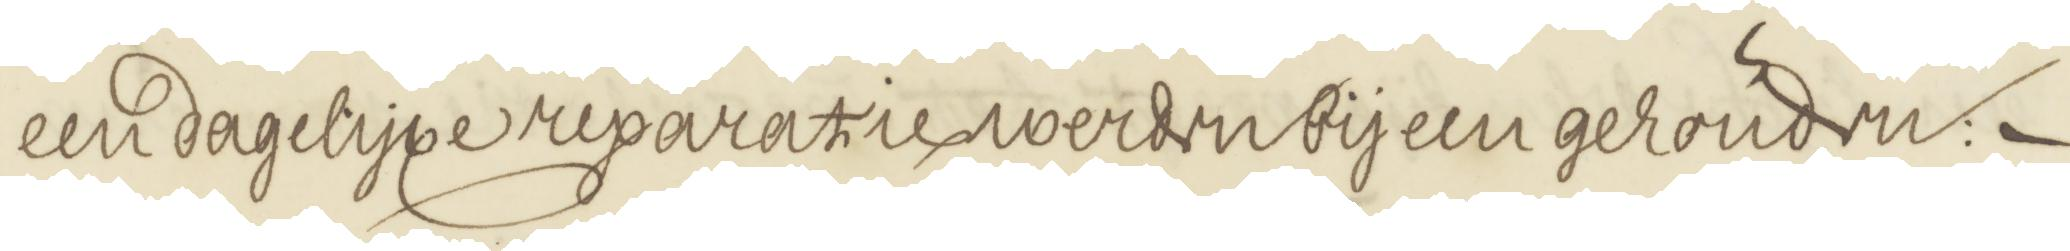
een dagelijxe reparatie werden bij een gehouden:
